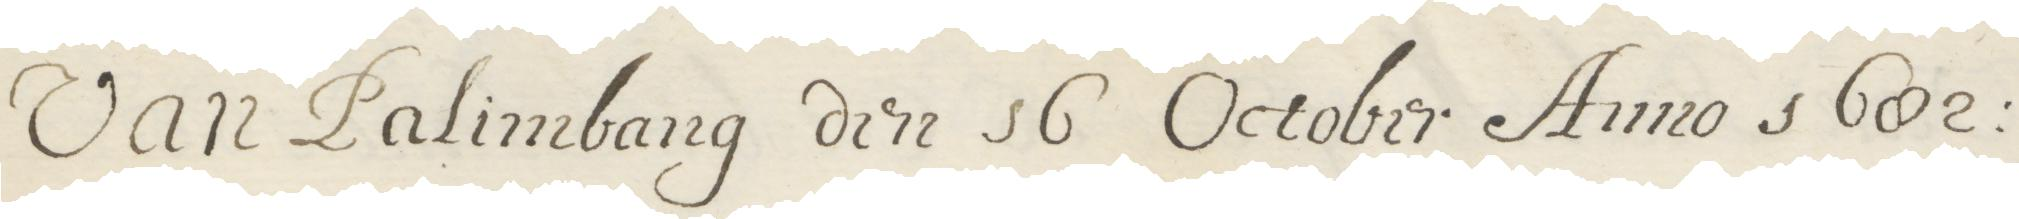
Van Palimbang den 16 October Anno 1682
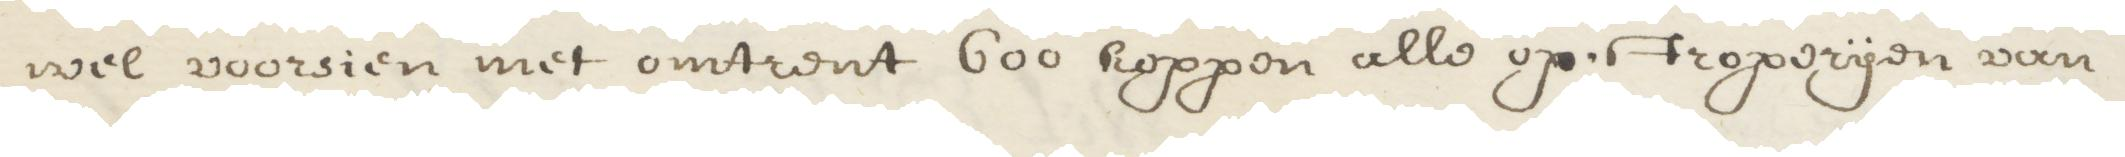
wel voorsien met omtrent 600 koppen alle op stroperijen van
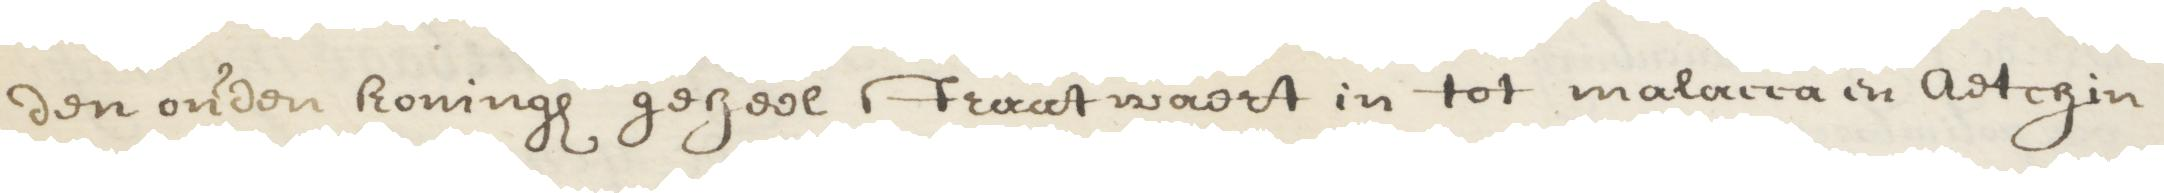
den ouden koningh geheel straat waert in tot malacca en Aetchin
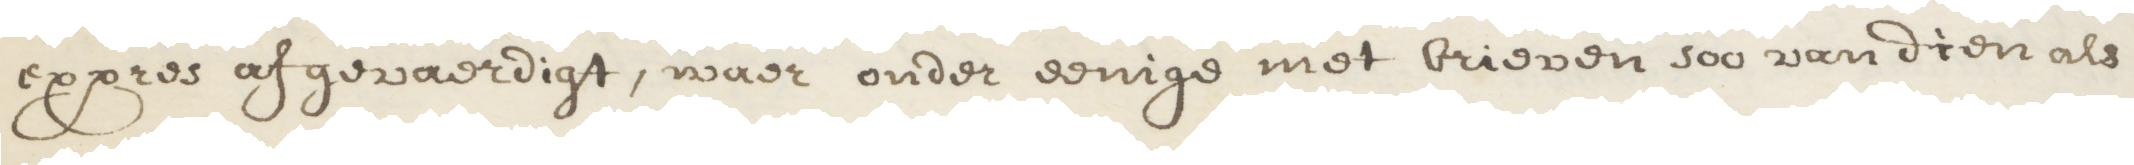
expres afgevaerdigt, waer onder eenige met brieven soo van dien als
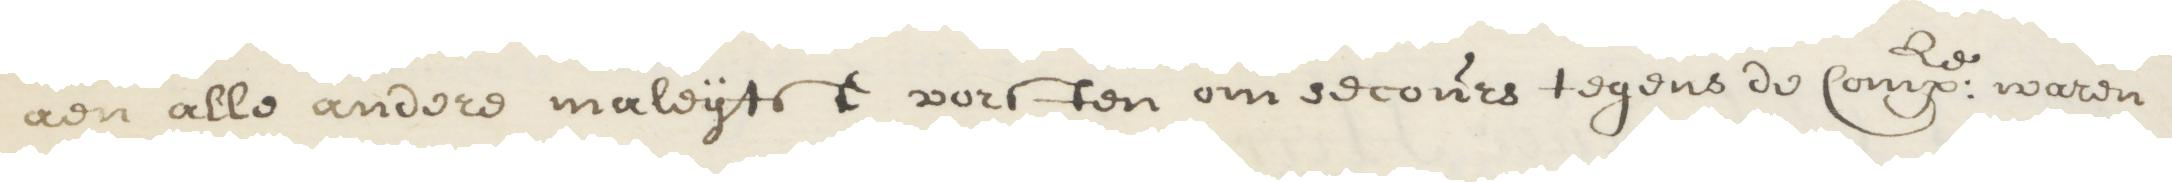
aen alle andere maleijtse vorsten om secours tegens de Comp:e waren
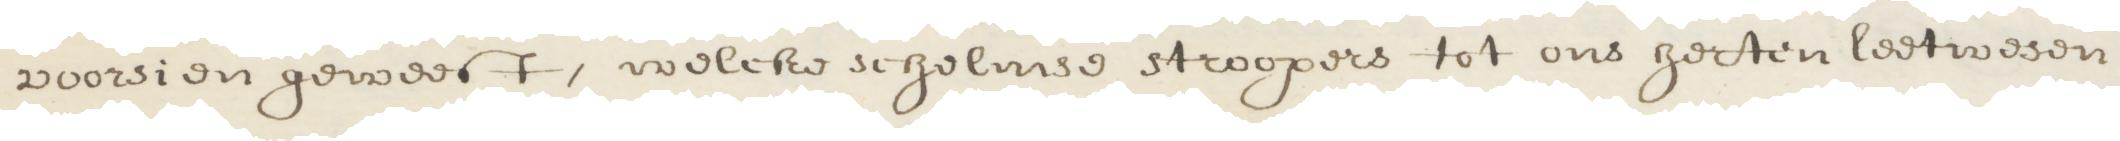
voorsien geweest, welcke schelmse stroopers tot ons herten leetwesen
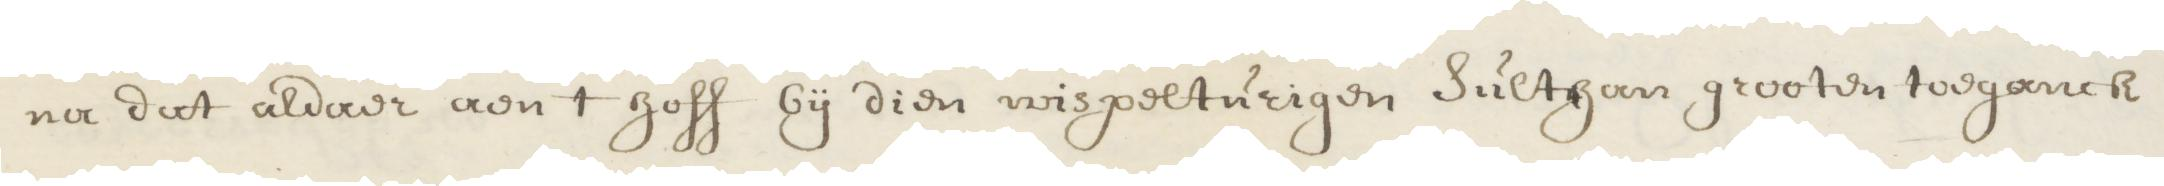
na dat aldaer aen 't hoff bij dien wispelturigen sulthan grooten toeganck
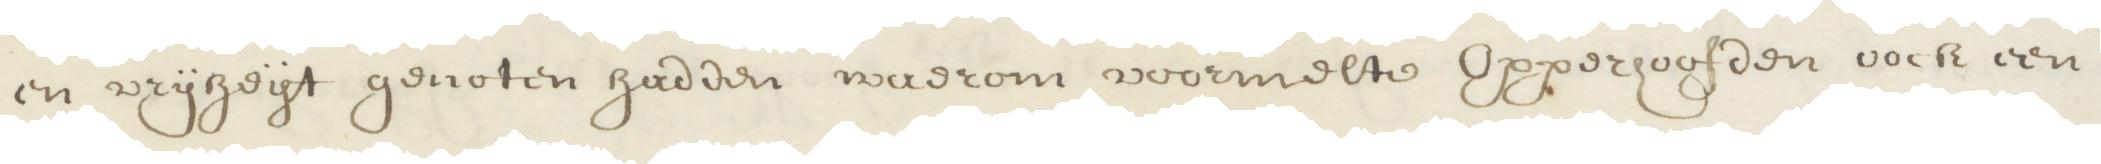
en vrijheijt genoten hadden waerom voormelte Opperhoofden oock een
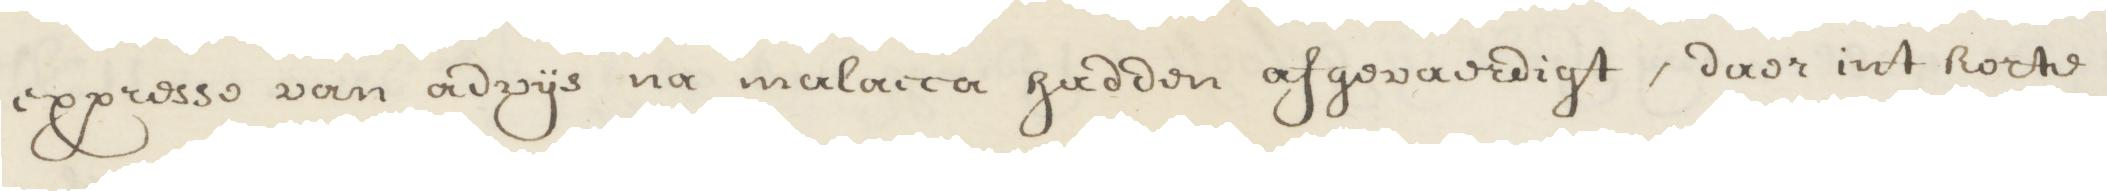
expresse van advijs na malacca hadden afgevaerdigt, daer int korte
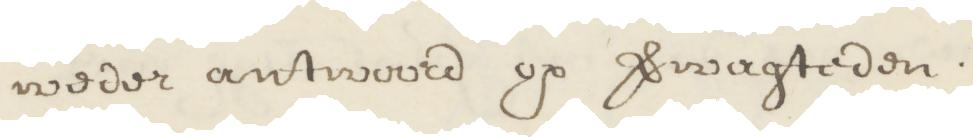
weder antwoord op verwagteden
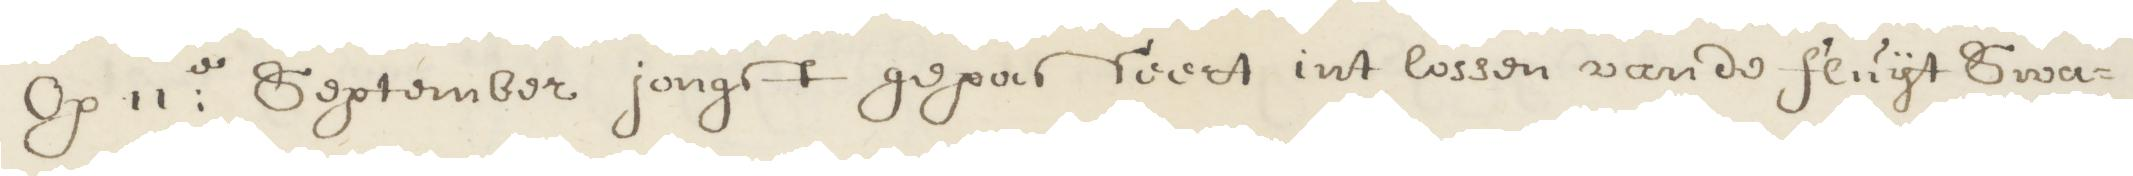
Op 11:e September jongst gepasseert int lossen van de fluijt Swa=
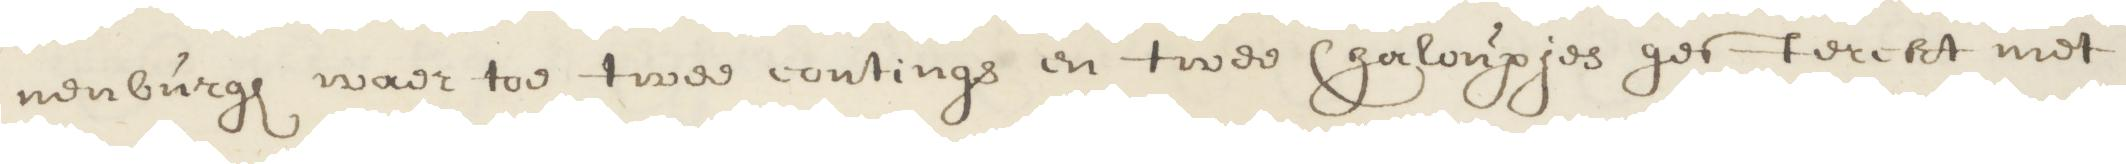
nenburgh waer toe twee contings en twee Chaloupjes gesterckt met
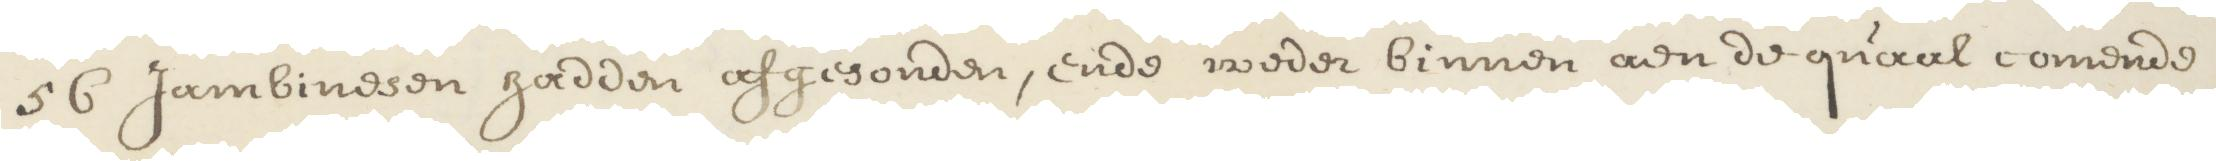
56 Jambinesen hadden afgesonden, ende weder binnen aen de quaal comende
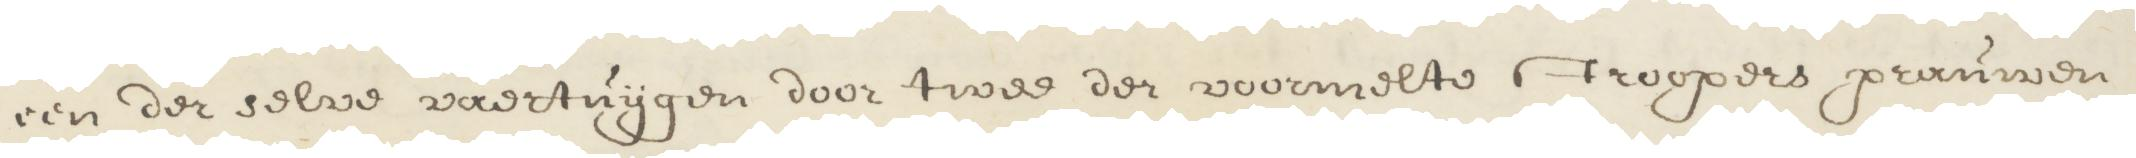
een der selve vaertuijgen door twee der voormelte stroopers prauwen
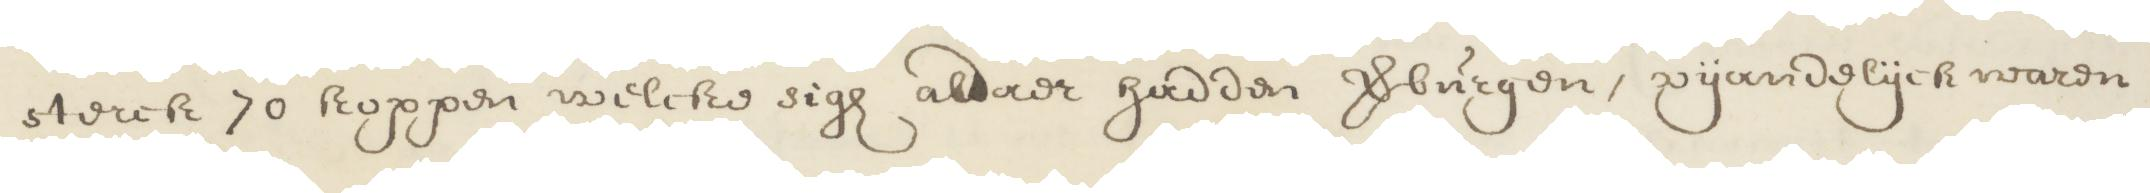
sterck 70 koppen welcke sigh aldaer hadden verburgen, vijandelijck waren
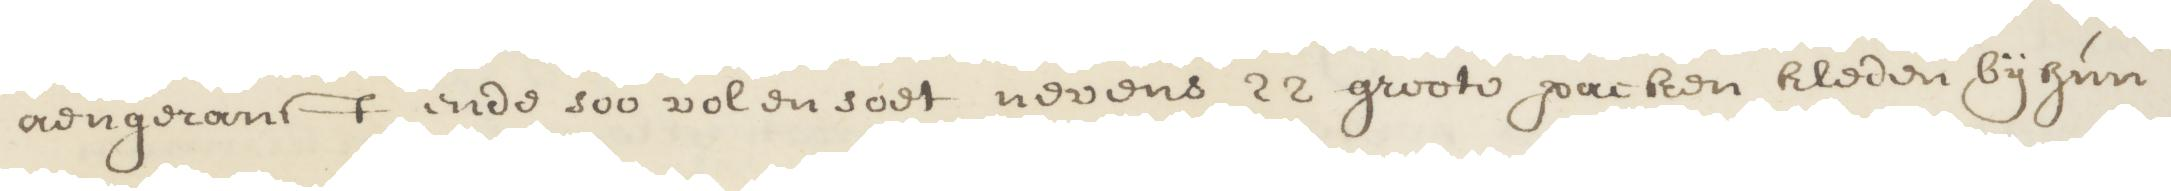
aengeranst ende soo vol en soet nevens 22 groote packen kleden bij hun
